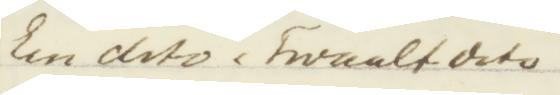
Een dito & Twaalf dito
